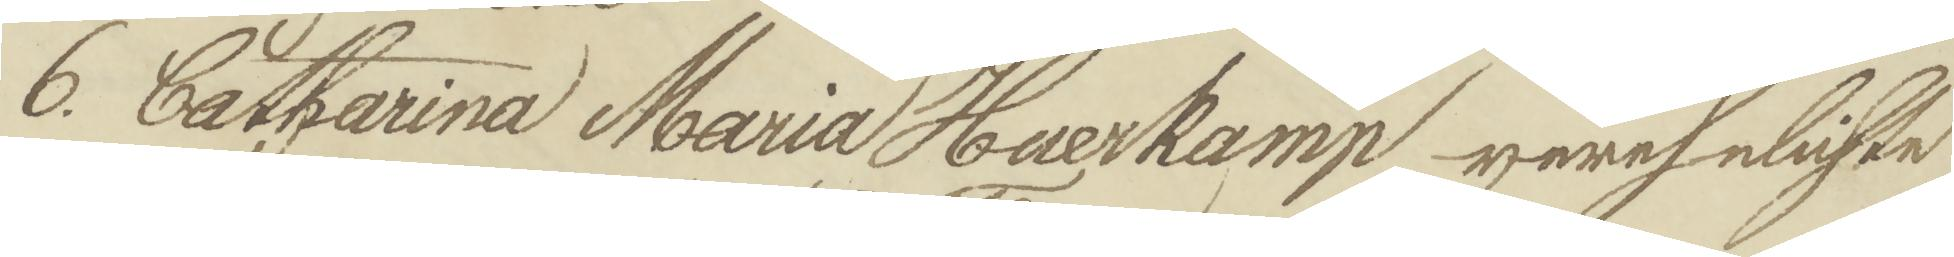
6. Catharina Maria Huerkamp, verehelichte
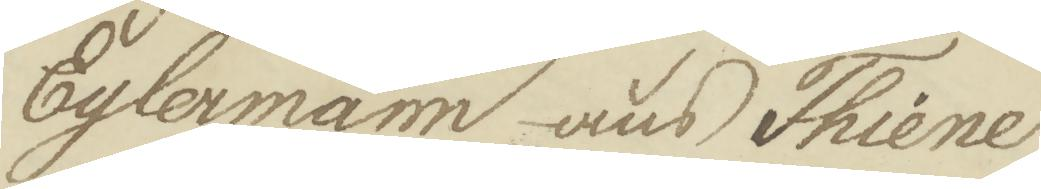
Eylerman aus Thiene
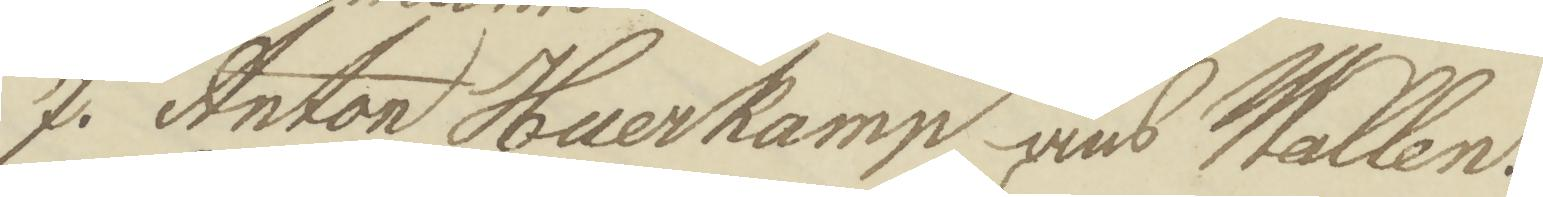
7. Anton Huerkamp aus Wallen.
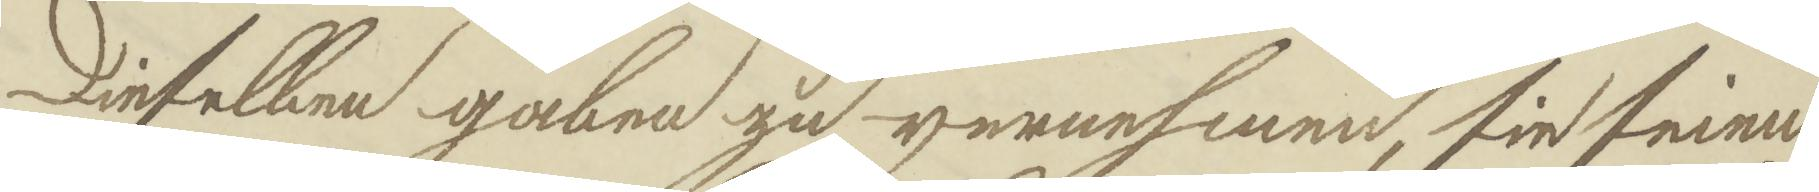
Dieselben gaben zu vernehmen, sie seien
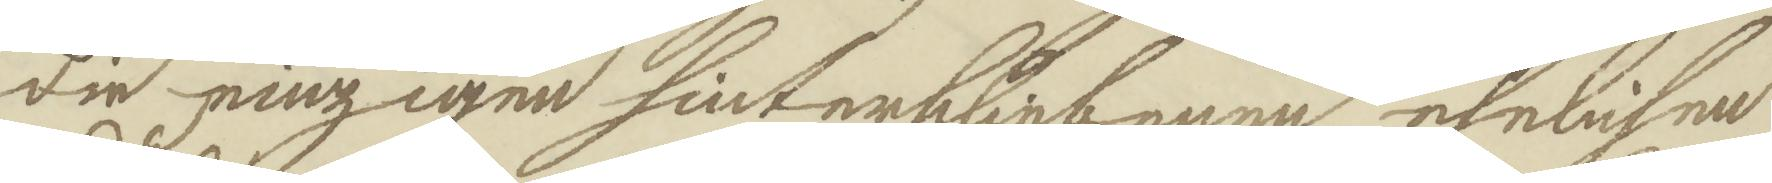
die einzigen hinterbliebene ahnlichen
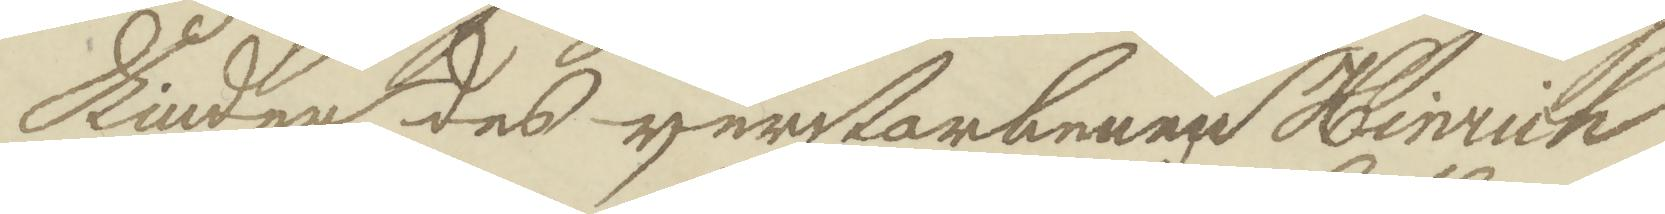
Kinder des verstorbenen Hinrich
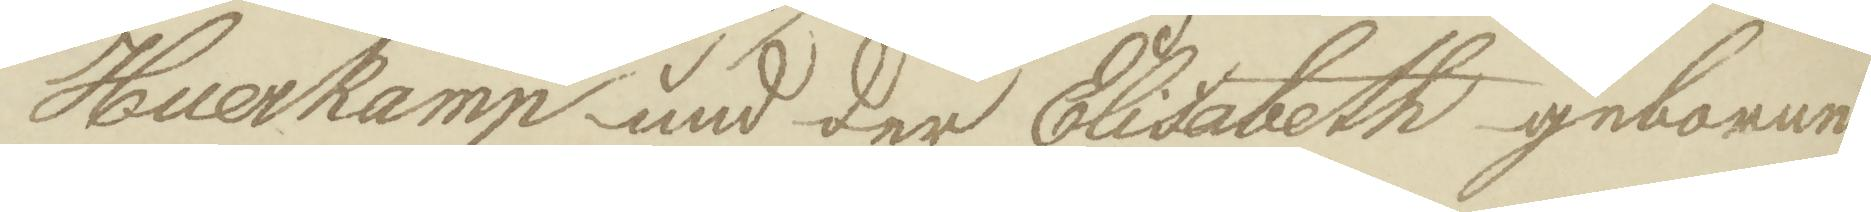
Huerkamp und der Elisabeth gebore
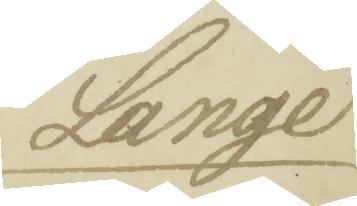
Lange
